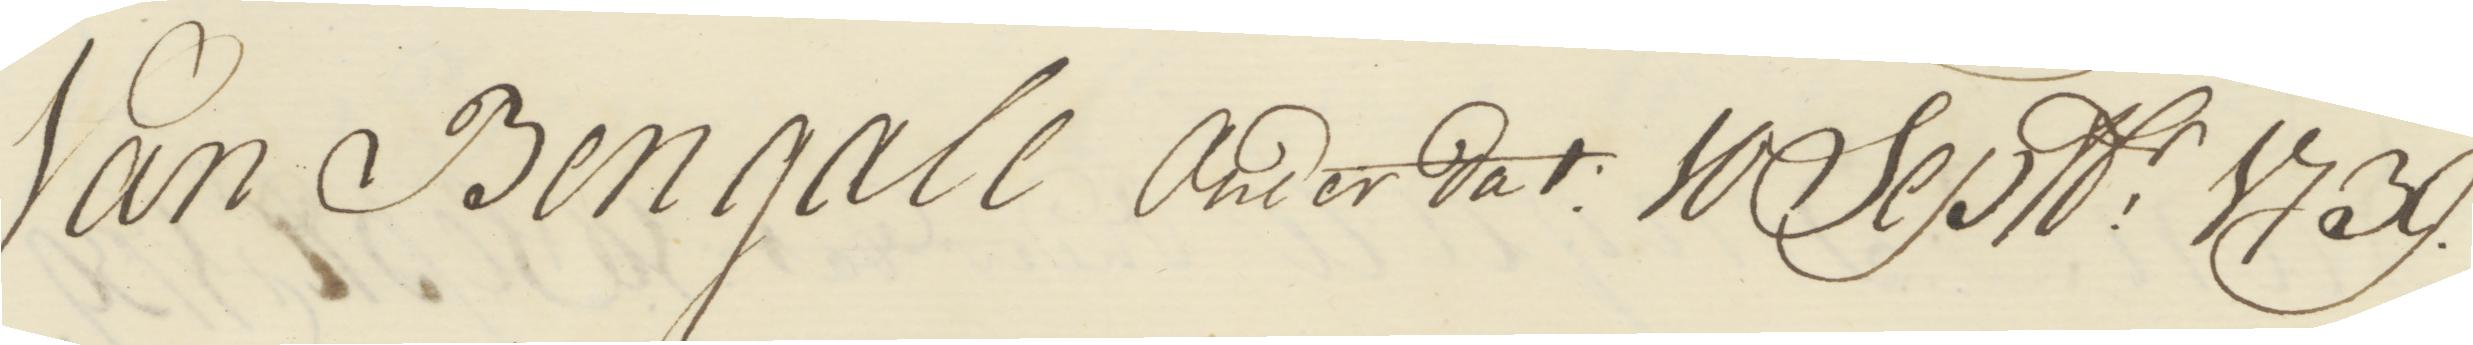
Van Bengale Onder dat: 10 Septb:r 1739.
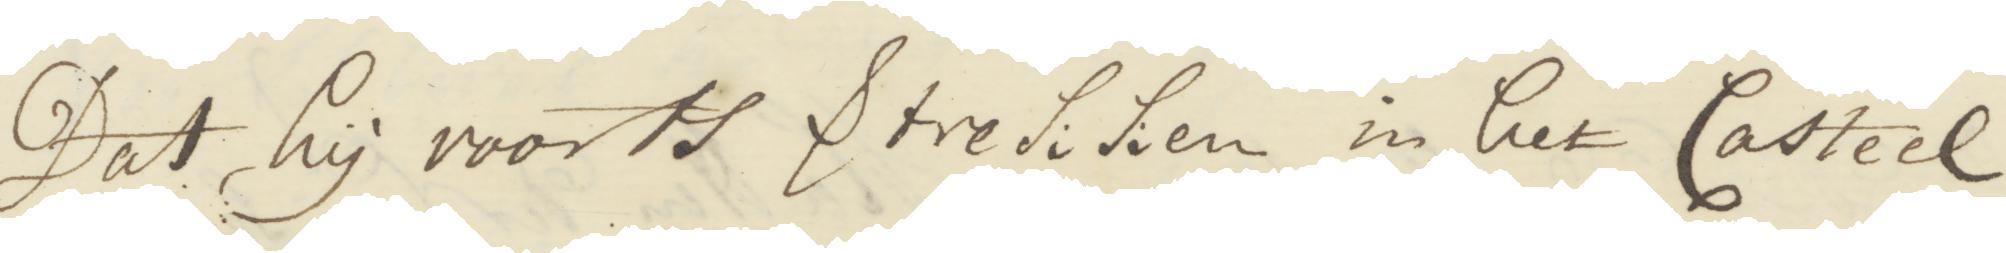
Dat hij voorts vertrekken in het Casteel
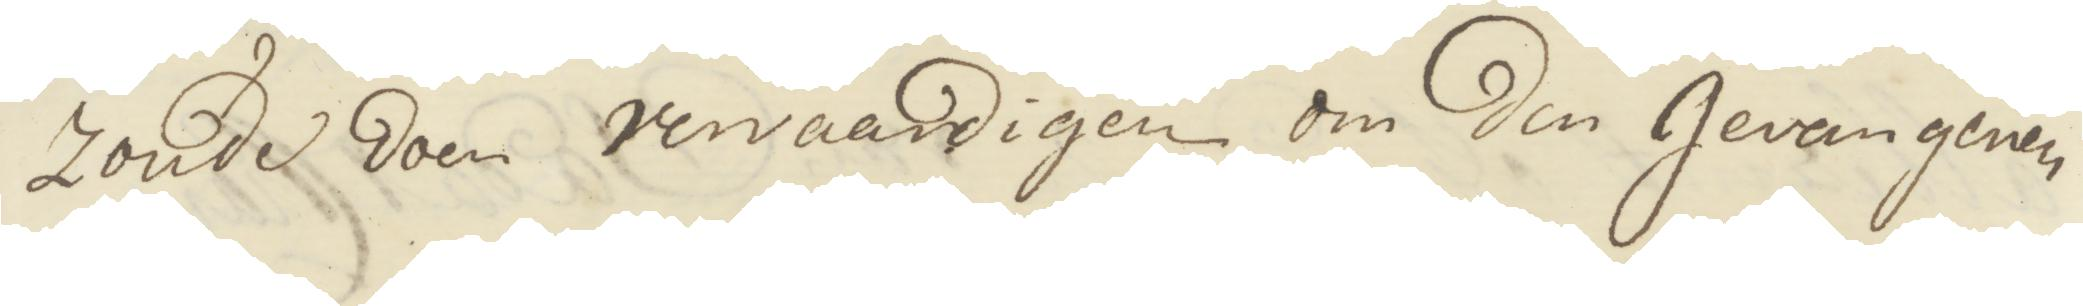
zoude doen vervaardigen om den gevangenen
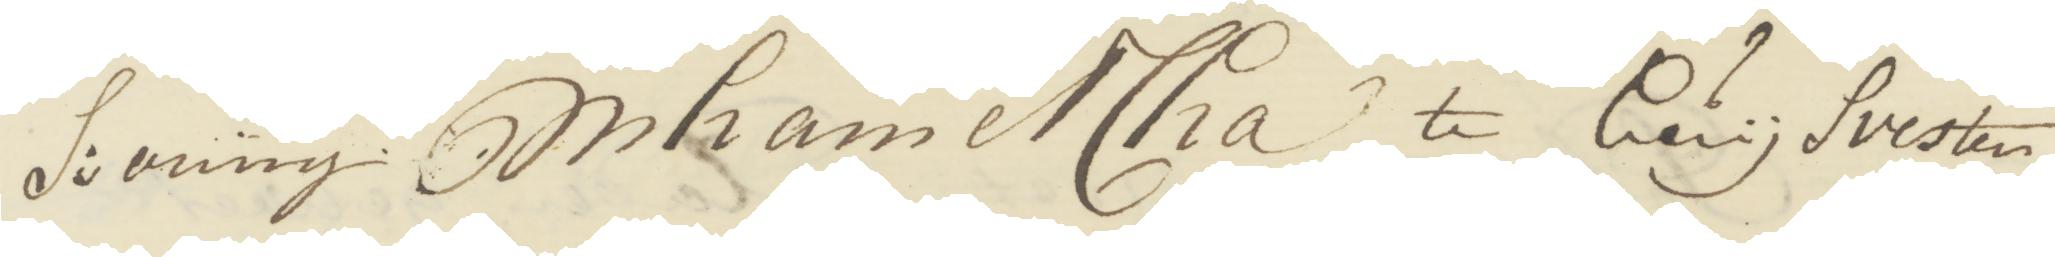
koning Mhametcha te huijsvesten,
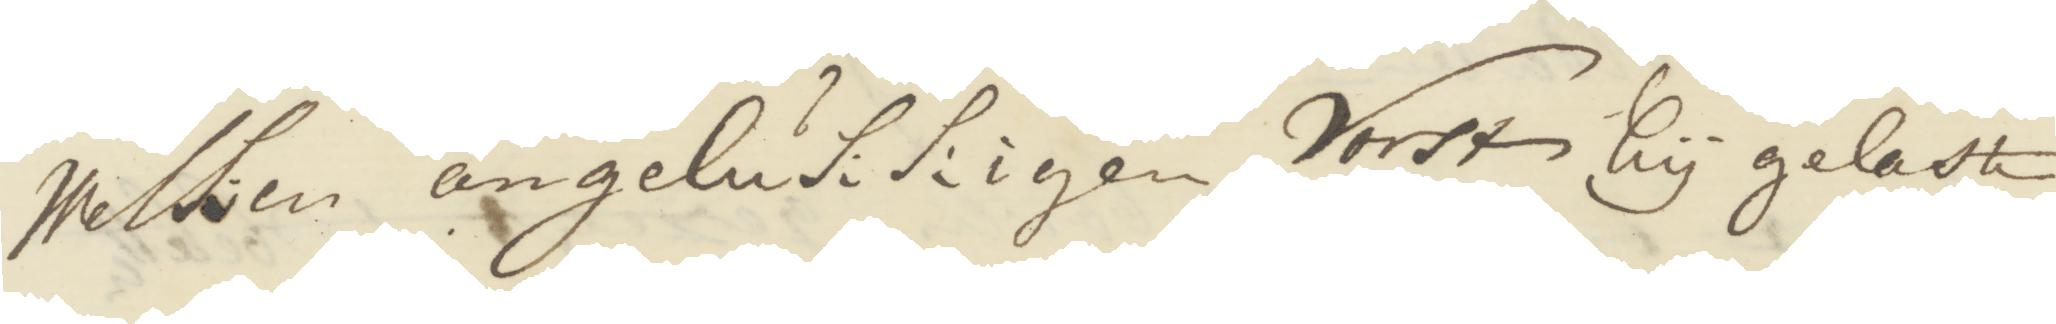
welken ongelukkigen Vorst hij gelaste
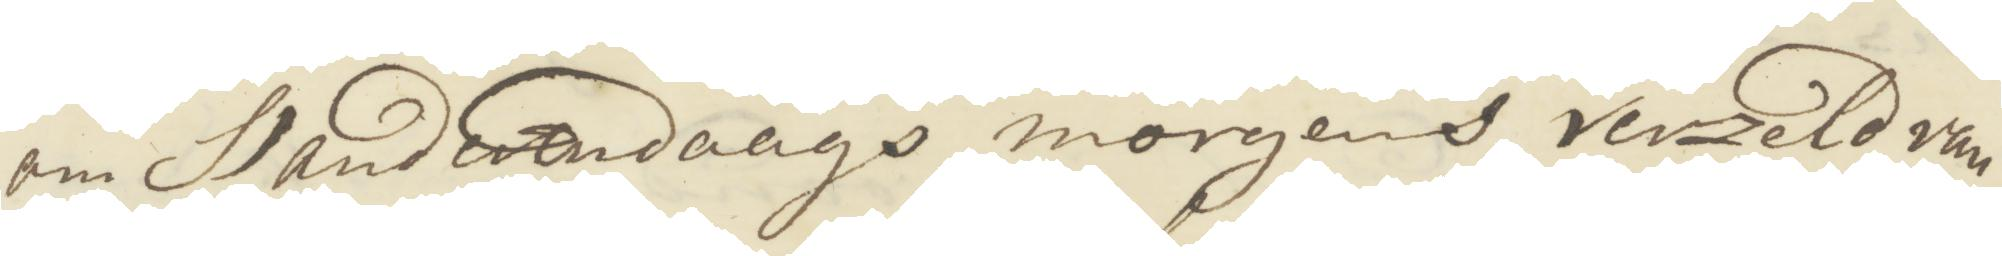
om s'anderendaags morgens verzeld van
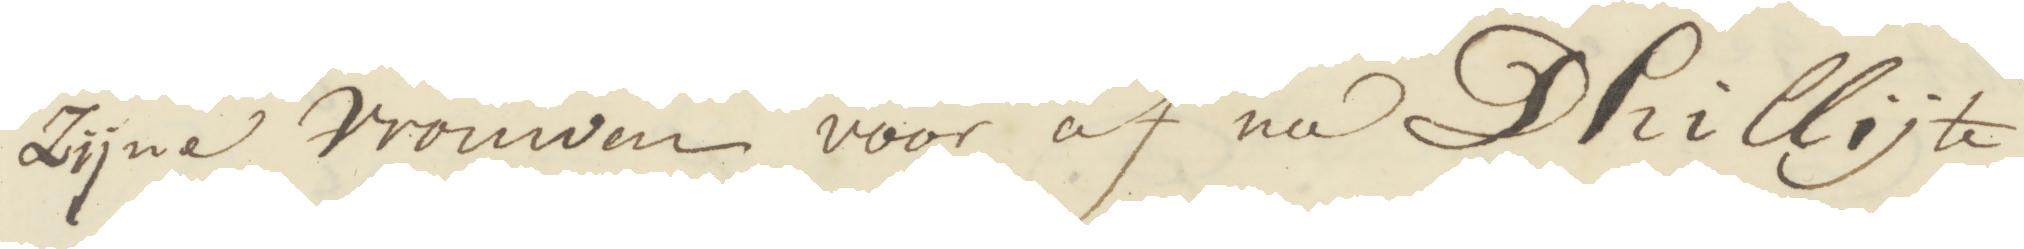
zijne vrouwen voor af na Dhillij te
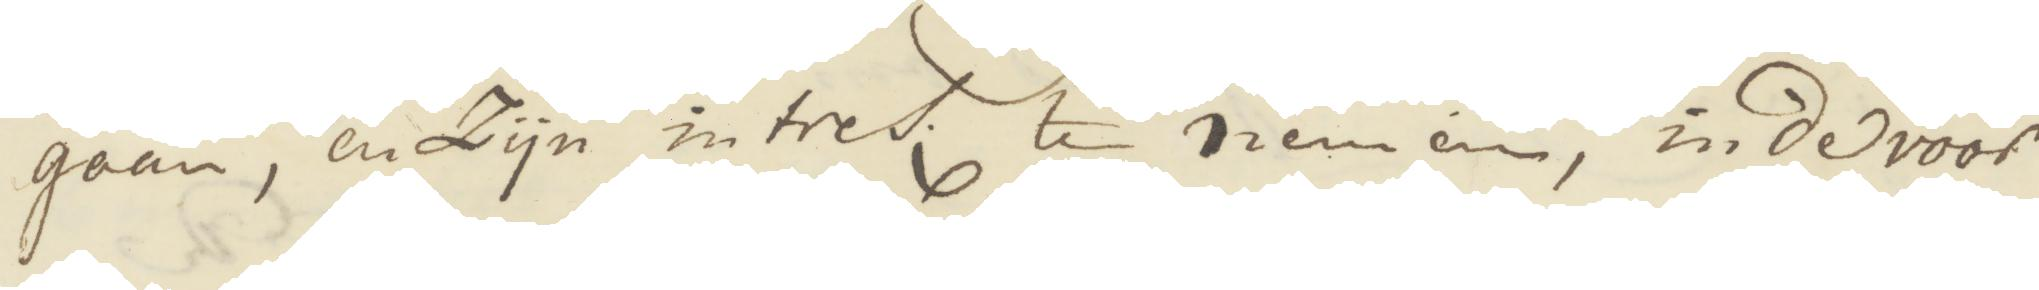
gaan, en zijn intrek te nemen, in de voor
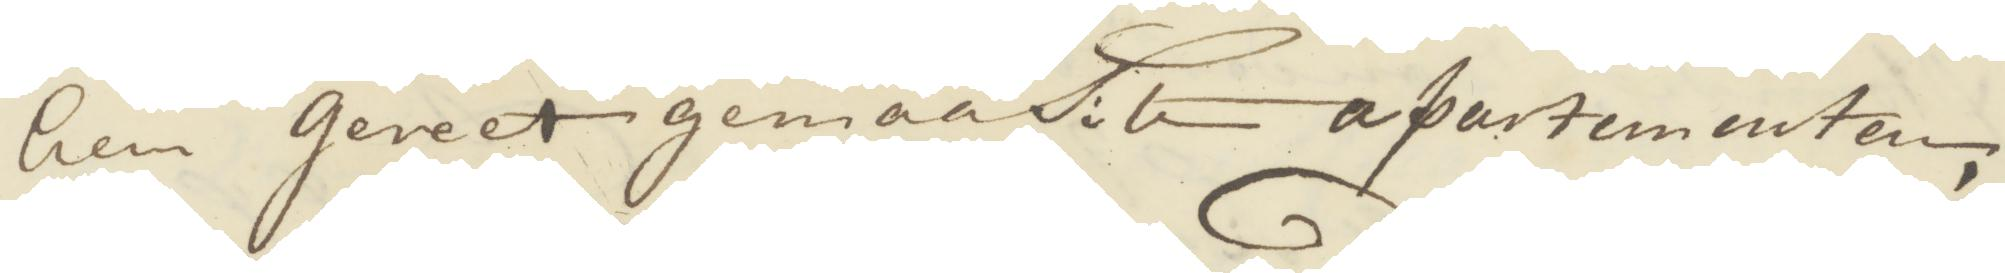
hem gereet gemaakte apartementen,
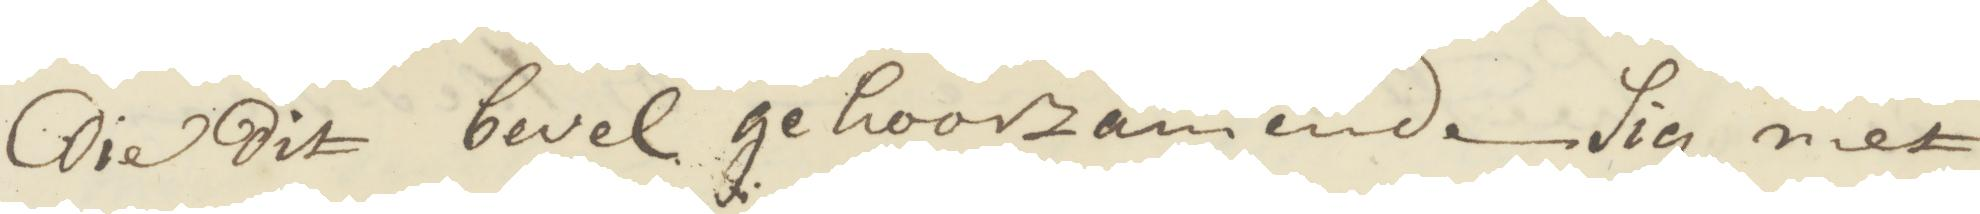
die dit bevel gehoorzamende sig met
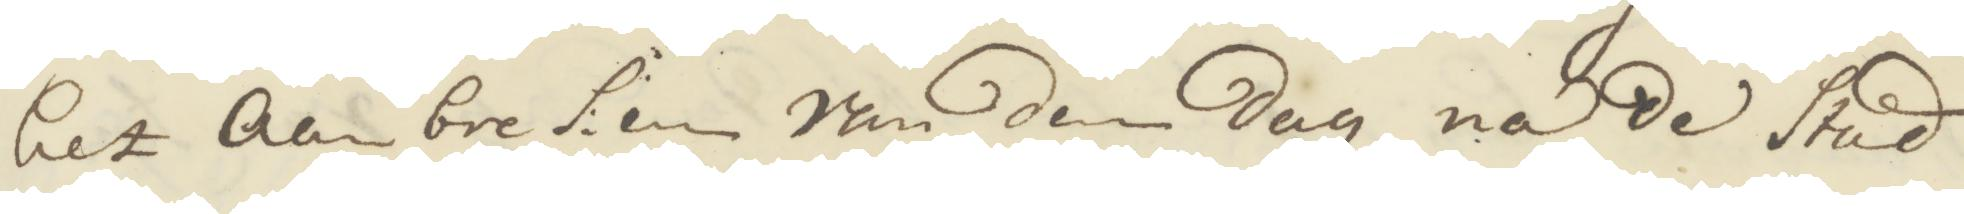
het aanbreken van den dag na de stad
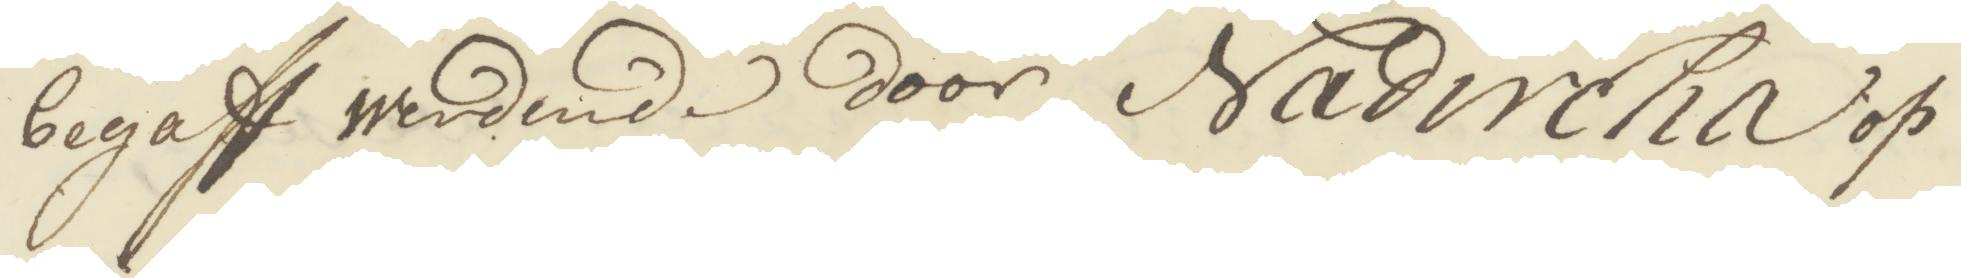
begaff werdende door Nadircha op
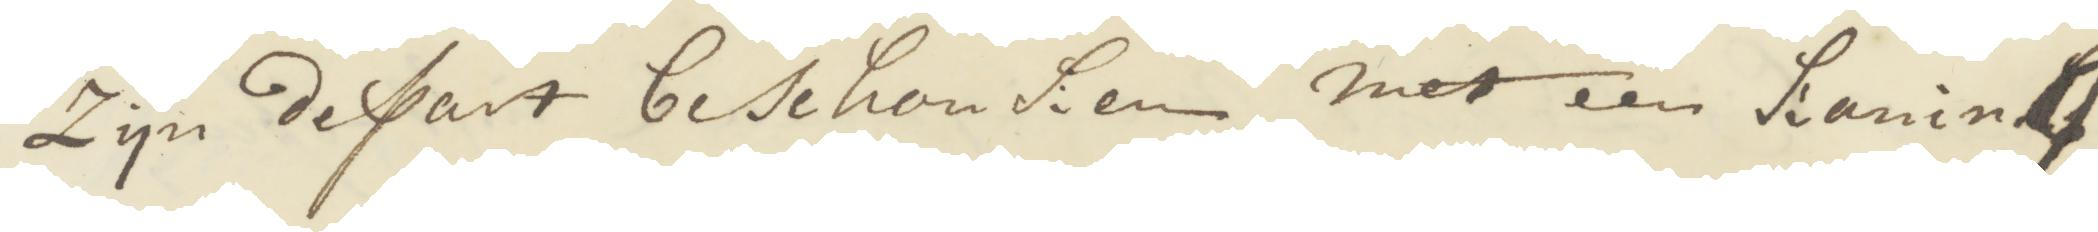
zijn depart beschonken met een koning
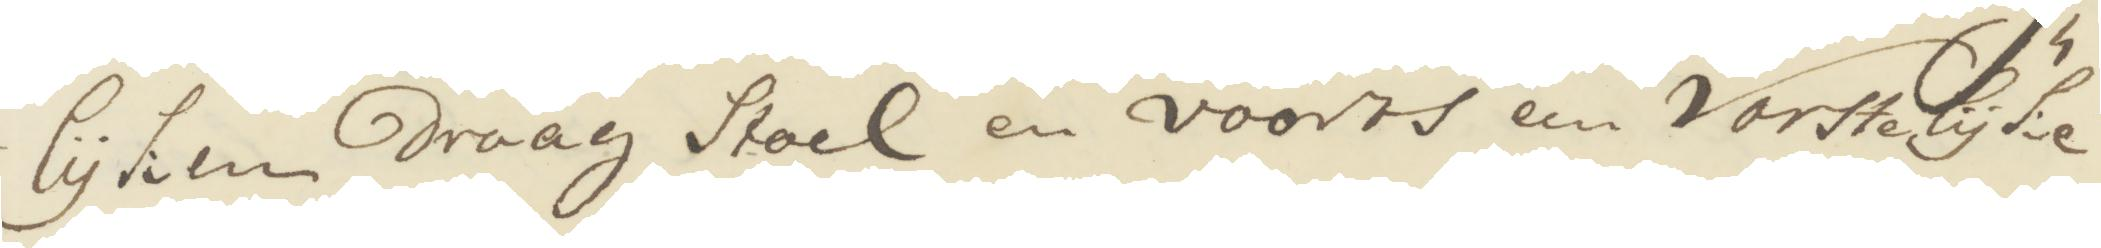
lijken draag stoel en voorts een Vorstelijke
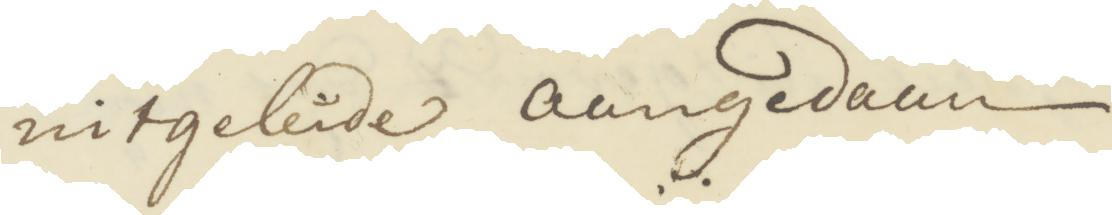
uitgeleide aangedaan
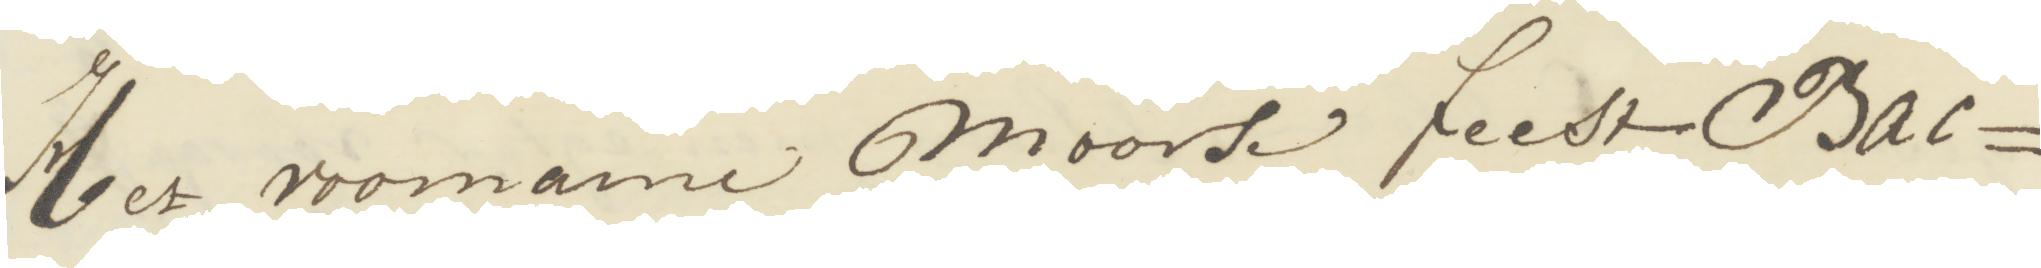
Het voorname moorse feest Bac=
